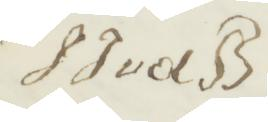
II vd B
